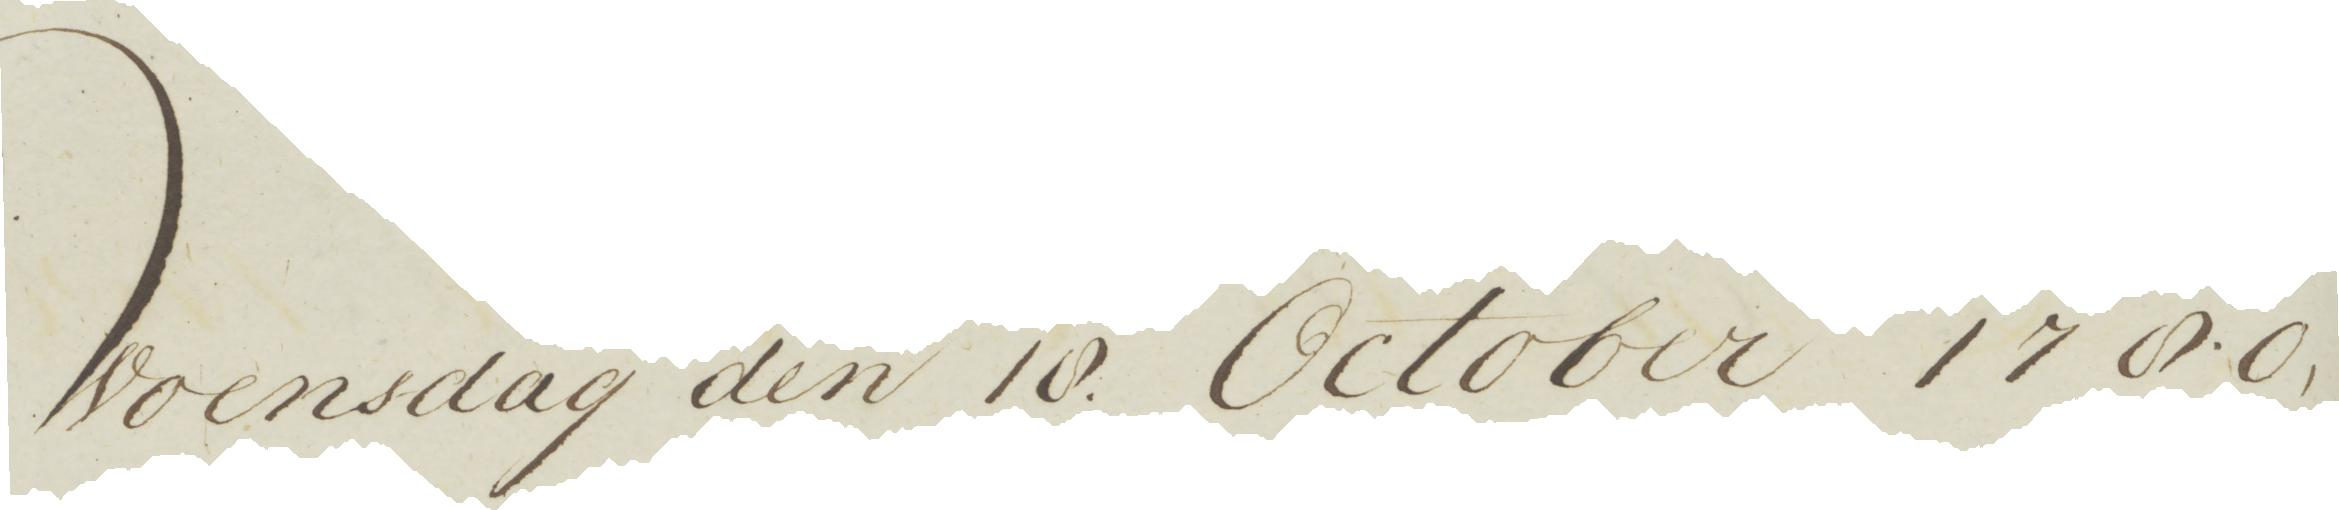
Woensdag den 18. October 1780,
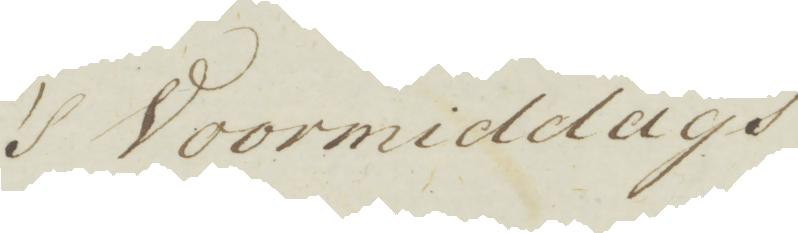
’s Voormiddags
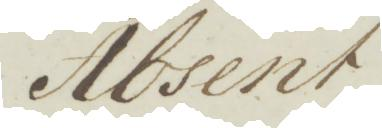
Absent
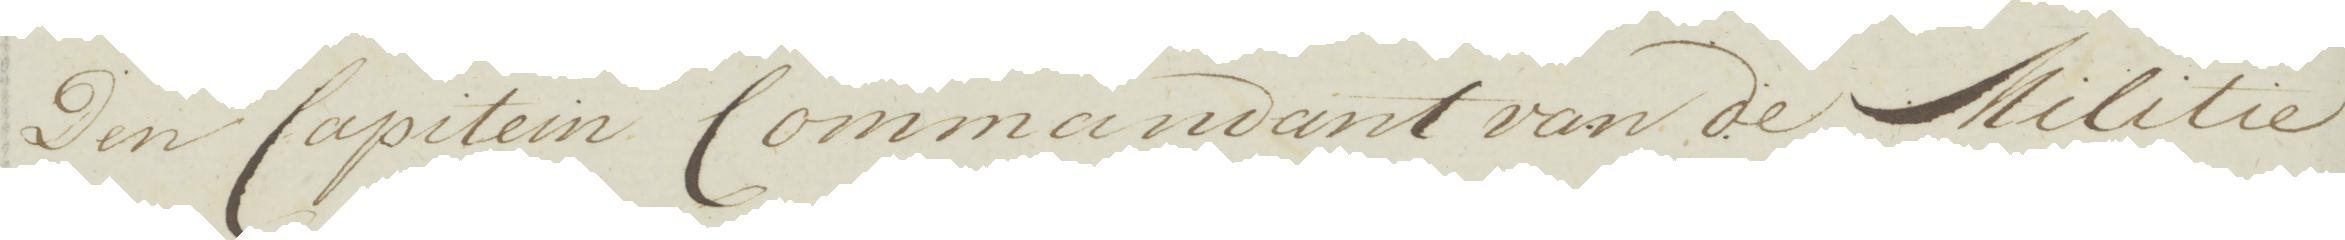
Den Capitein Commandant van de Militie
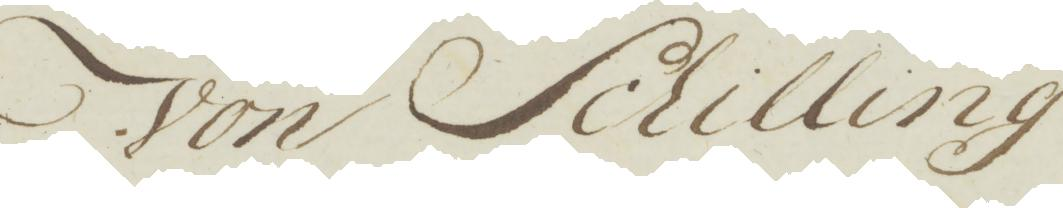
Von Schilling
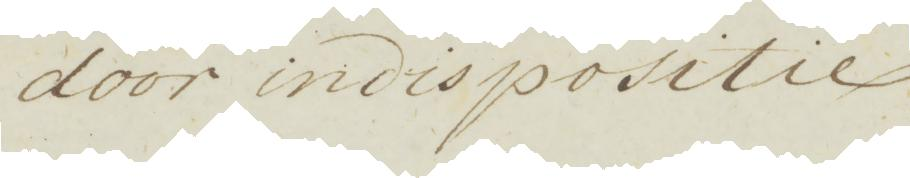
door indispositie
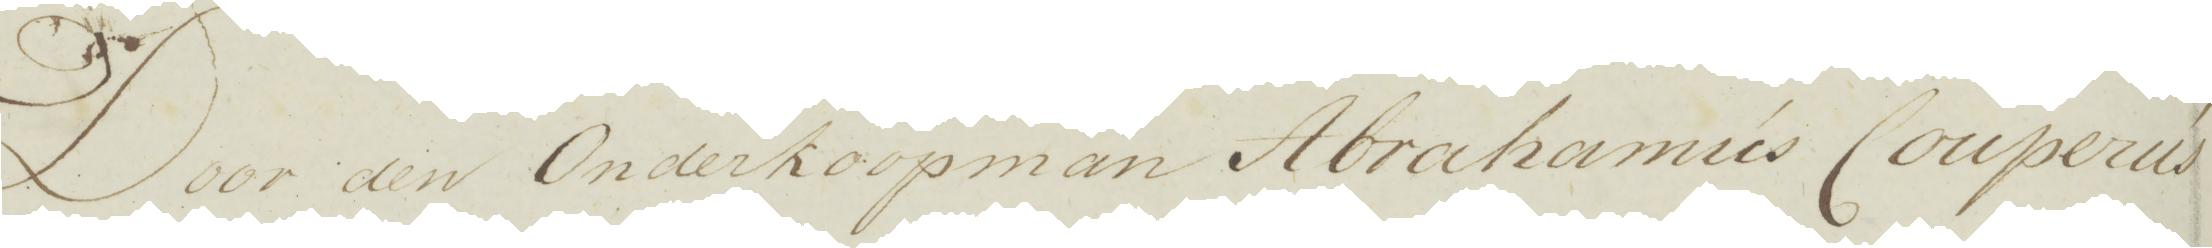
Door den Onderkoopman Abrahamus Couperus
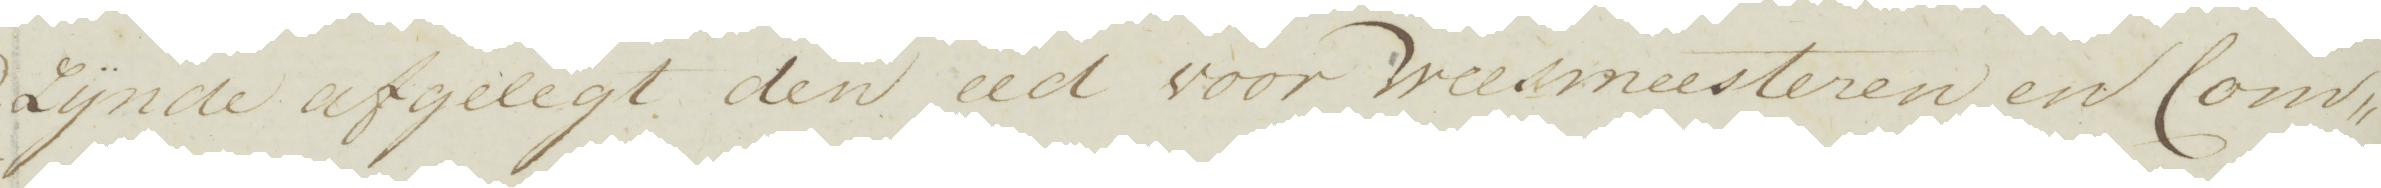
zijnde afgelegt den eed voor weesmeesteren en Com„
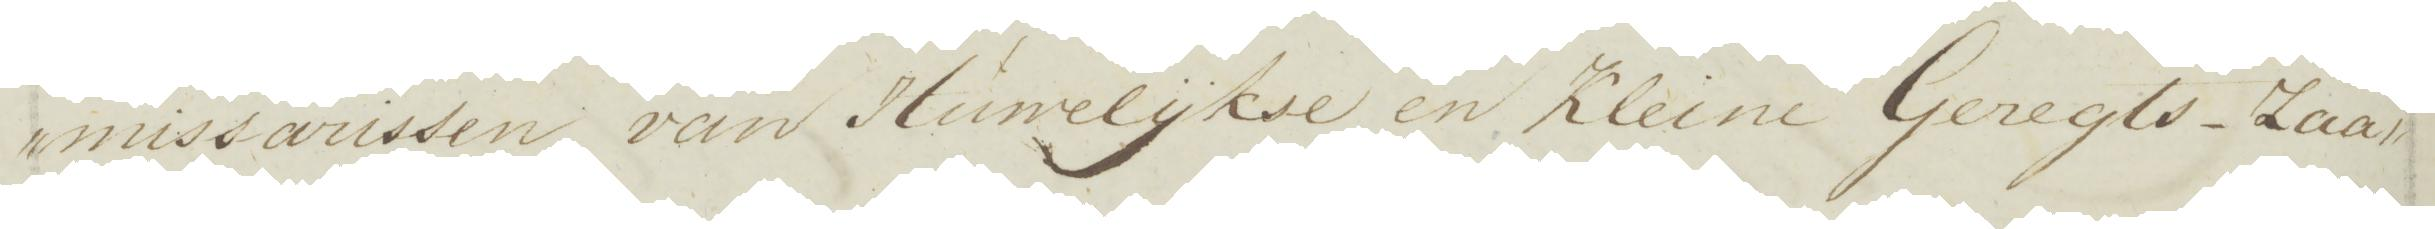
missarissen van Huwelijkse en Kleine Geregts-Zaa„
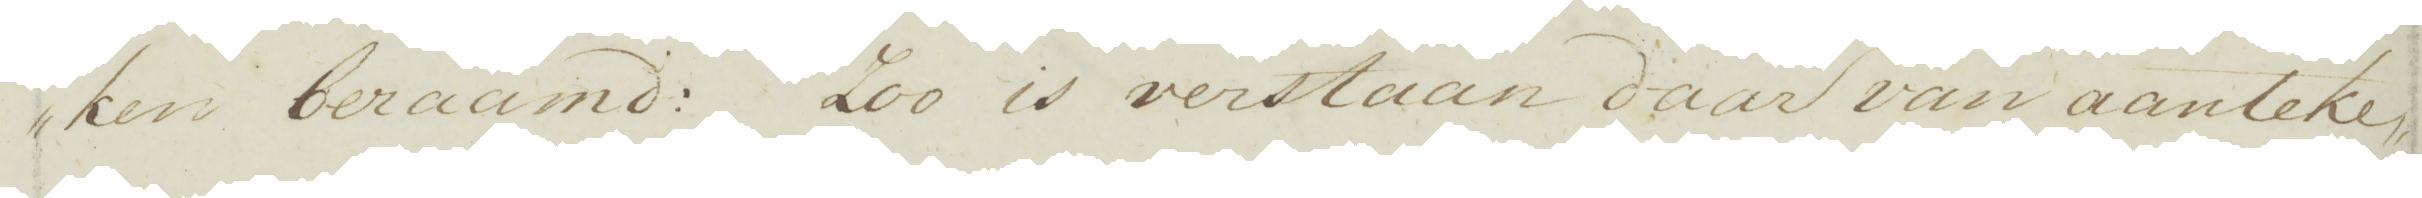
„ ken beraamd: Zoo is verstaan daar van aanteke„
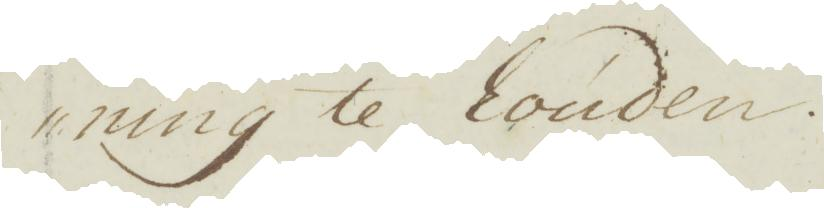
„ ning te houden.
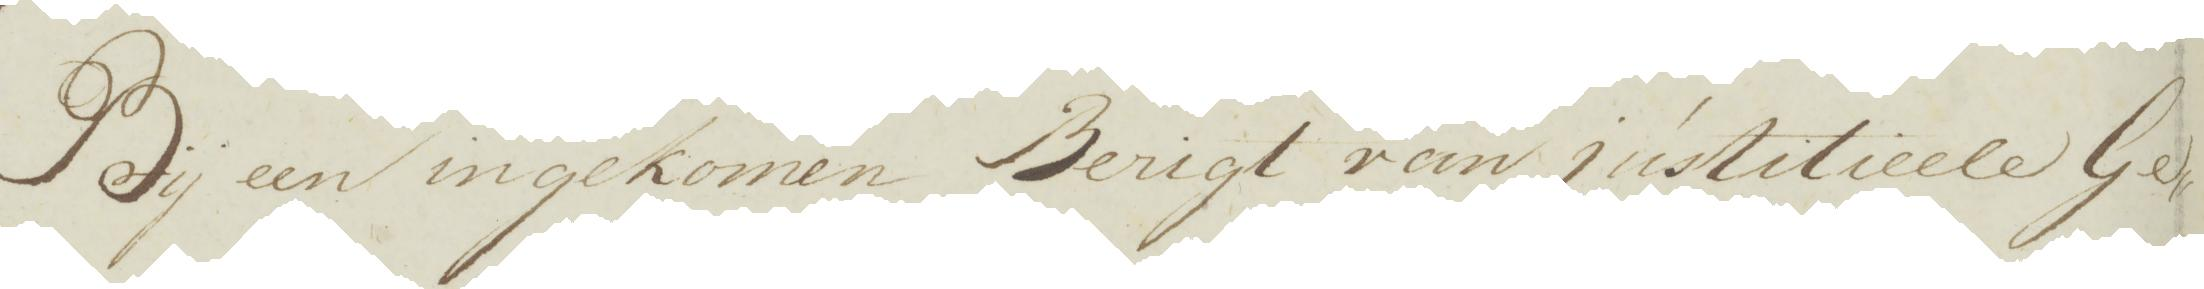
Bij een ingekomen Berigt van justitieele Ge„
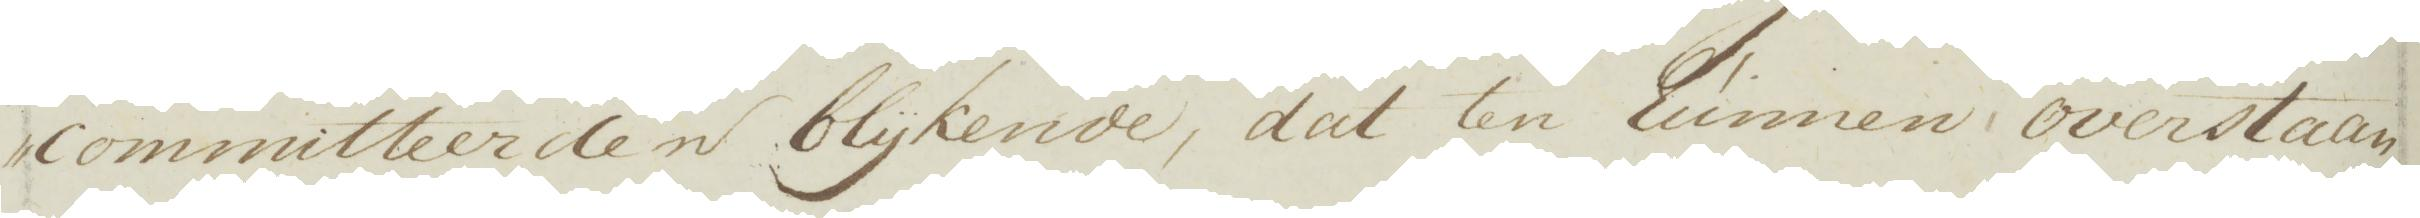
committeerden blijkende, dat ten hunnen overstaan
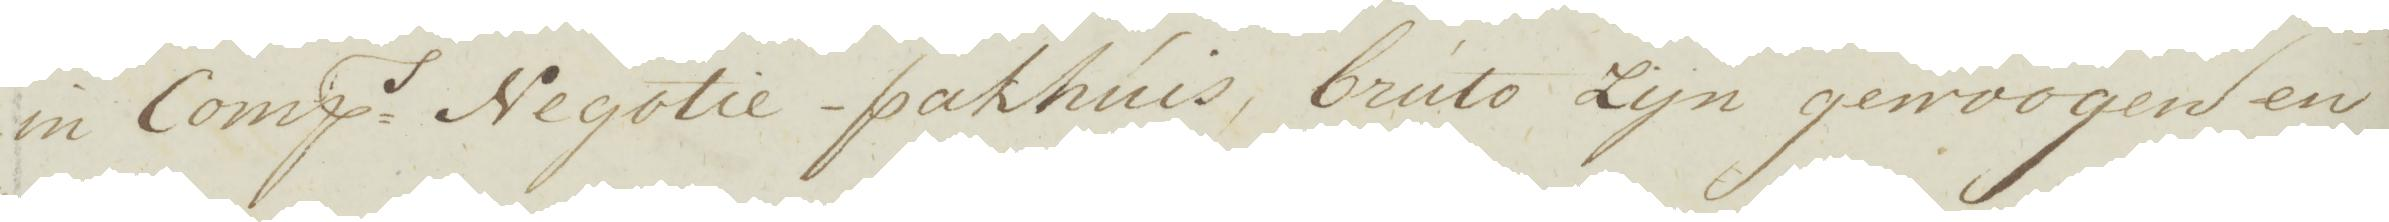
in Comp=s Negotie pakhuis, bruto zijn gewoogen en
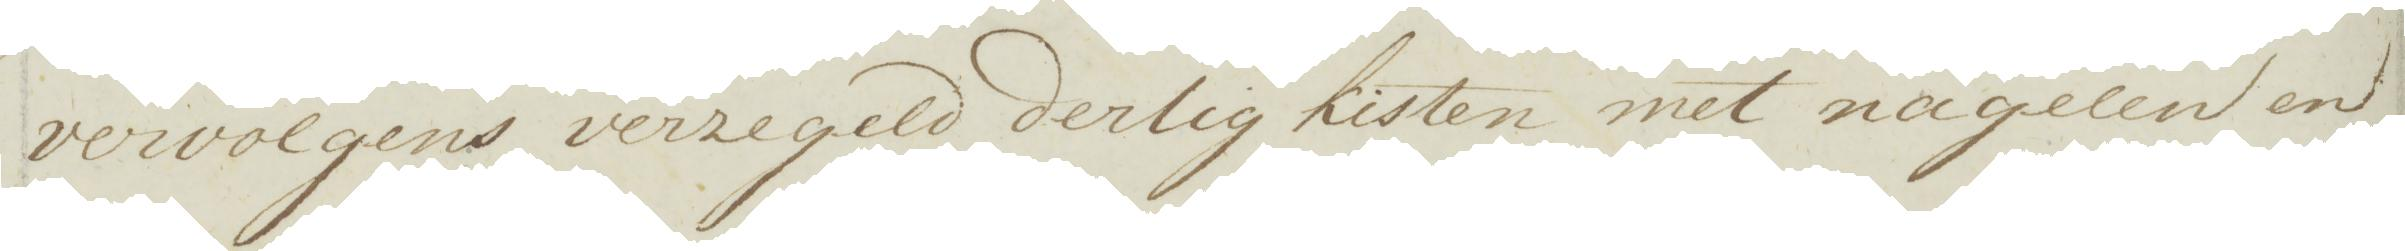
vervolgens verzegeld dertig kisten met nagelen en
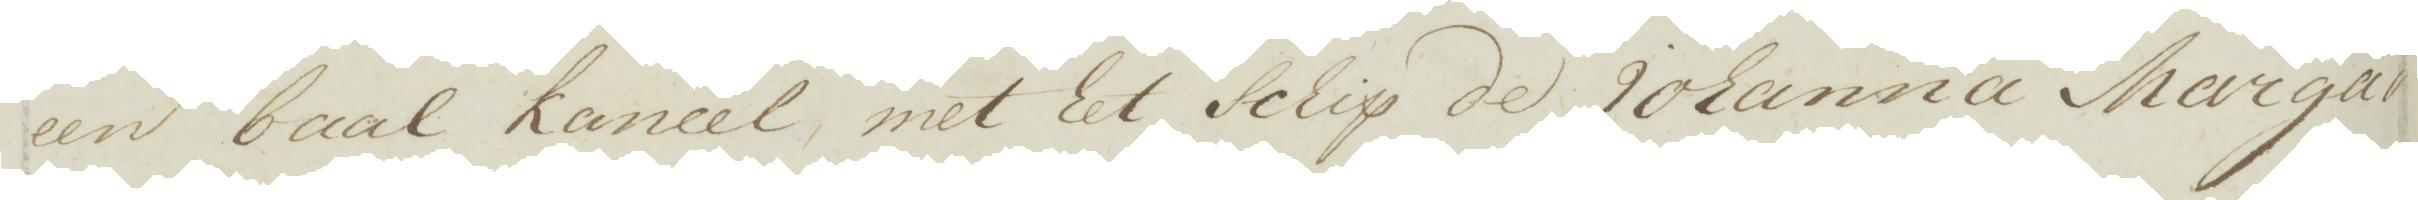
een baal kaneel, met het schip de Johanna Marga
